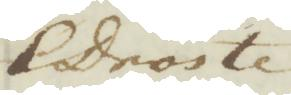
E Droste
